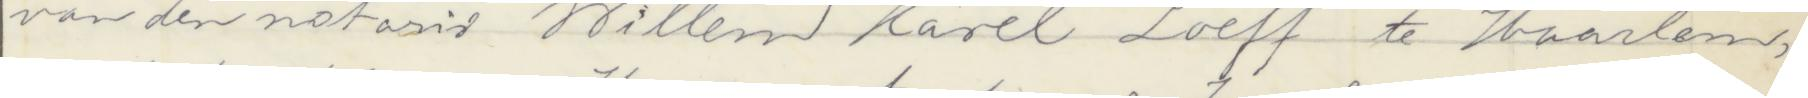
van den notaris Willem Karel Loeff te Haarlem,
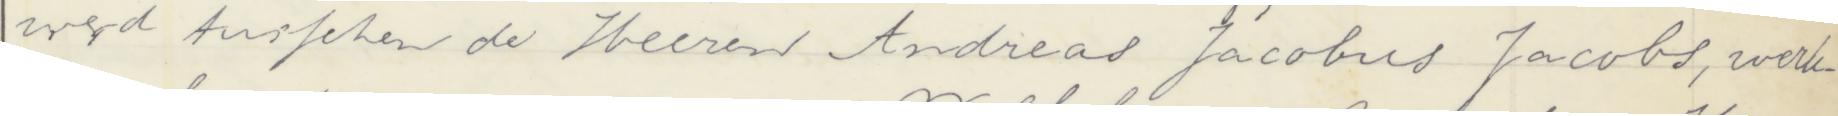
werd tussen de Heeren Andreas Jacobus Jacobs, werk
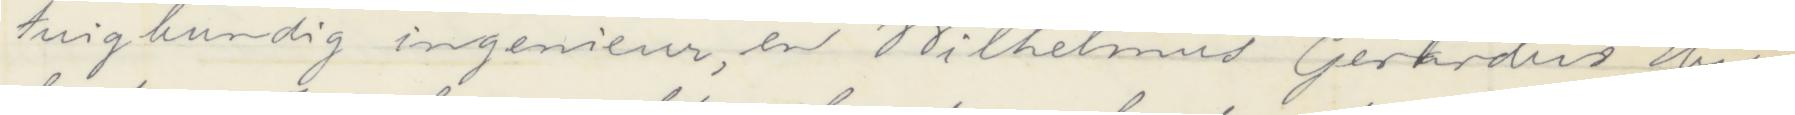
tuigkundig ingenieur, en Wilhelmus Gerardus Hu-
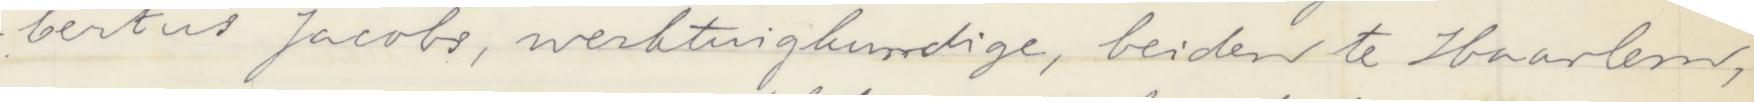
bertus Jacobs, werktuigkundige, beiden te Haarlem,
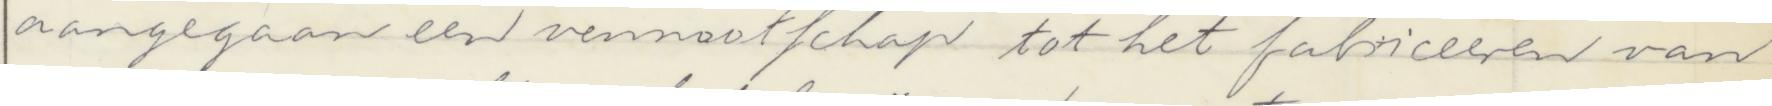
aangegaan een vennootschap tot het fabriceeren van
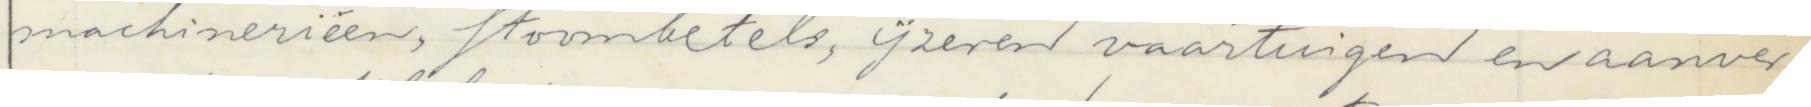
machinerieën, stoomketels, ijzeren vaartuigen en aanver-
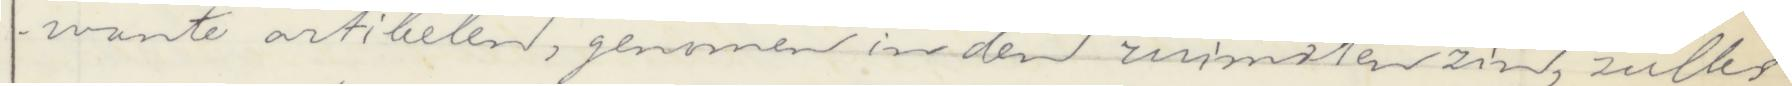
wante artikelen, genomen in den ruijmsten zin, zulks
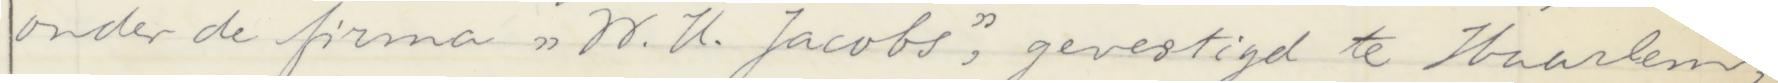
onder de firma „W.H. Jacobs", gevestigd te Haarlem,
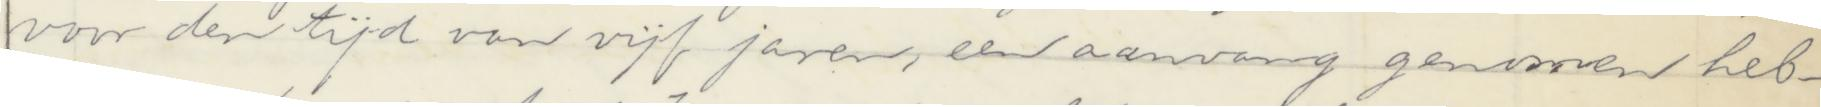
voor den tijd van vijf jaren, een aanvang genomen heb-
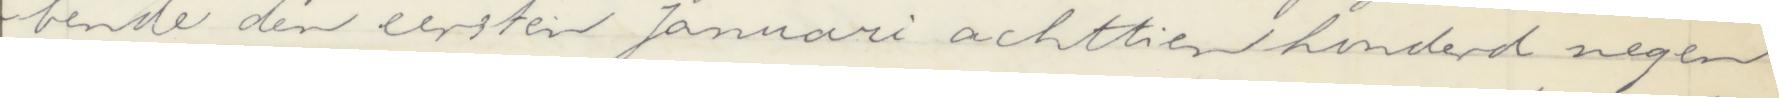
bende den eersten Januari achttien honderd negen
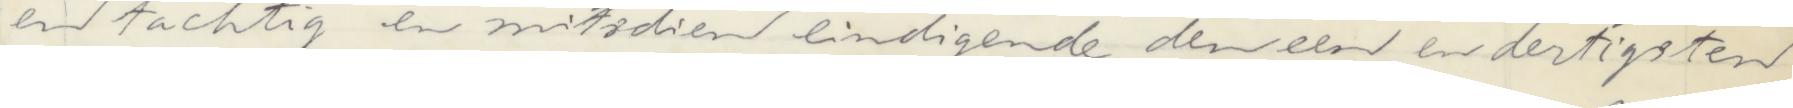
en tachtig en mitsdien eindigende den een en dertigsten
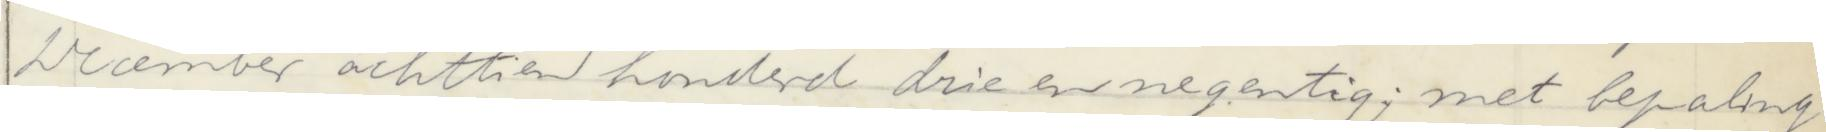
December achttien honderd drie en negentig; met bepaling
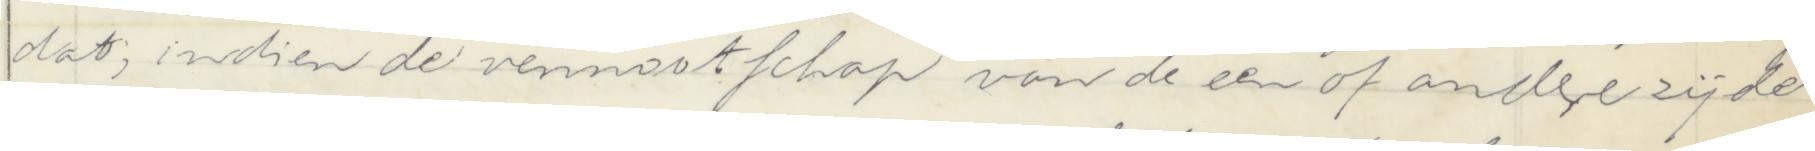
dat, indien de vennootschap voor de een of andere zijde
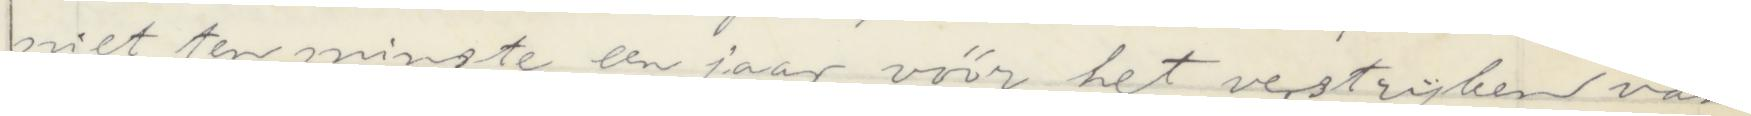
niet ten minste een jaar vóór het verstrijken van
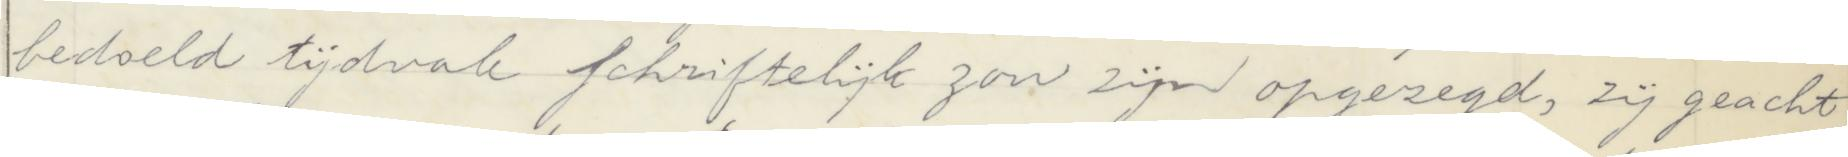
bedoeld tijdvak schriftelijk zou zijn opgezegd, zij geacht
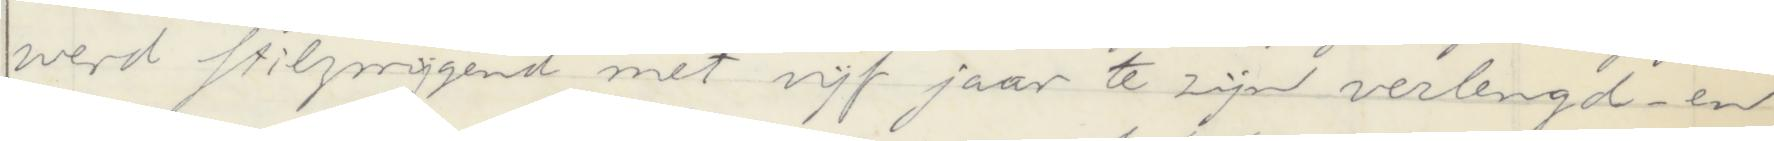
werd stilzwijgend met vijf jaar te zijn verlengd- en
